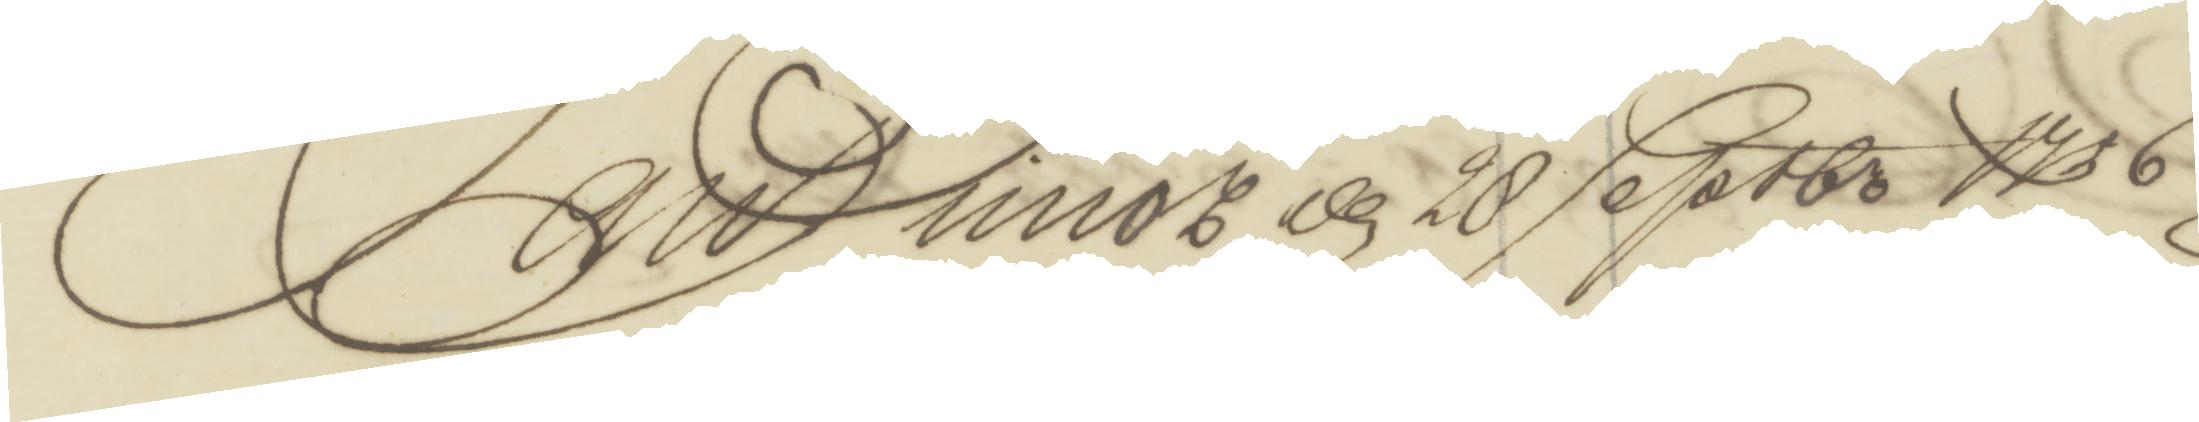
Van Timor den 28 Septbr 1756
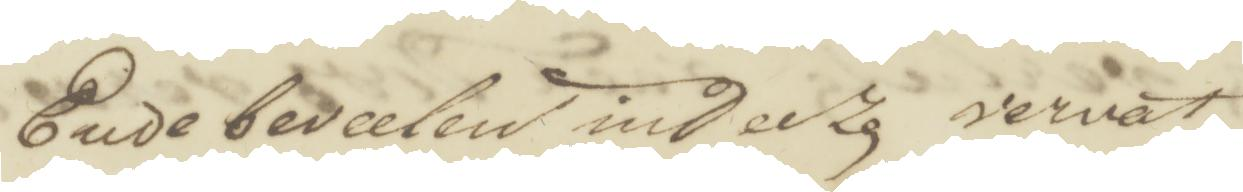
Ende beveelen indeezen vervat
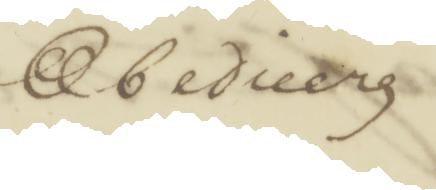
Obedieeren
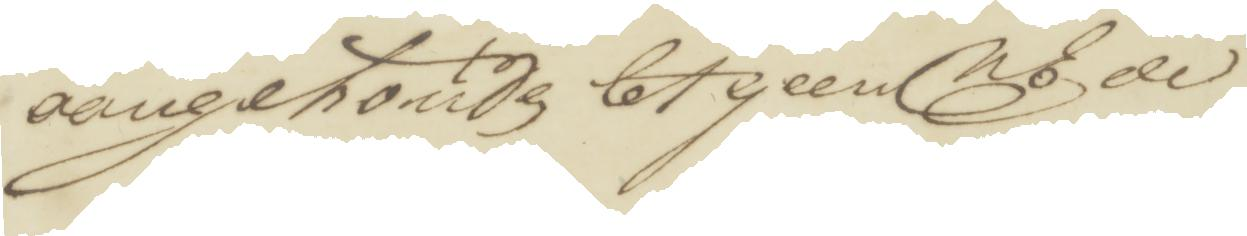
aangehouden het geen uE de
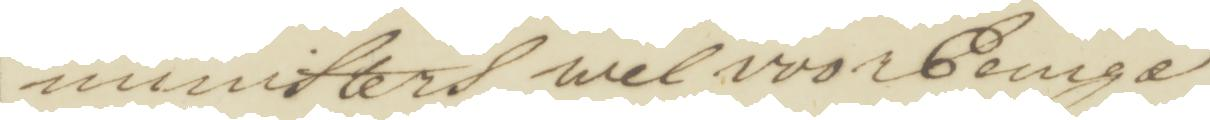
ministers wel voor Eenige
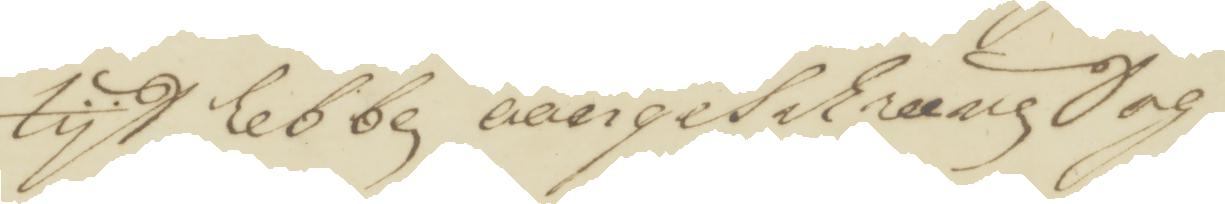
tijd hebben aangeschreeven dog
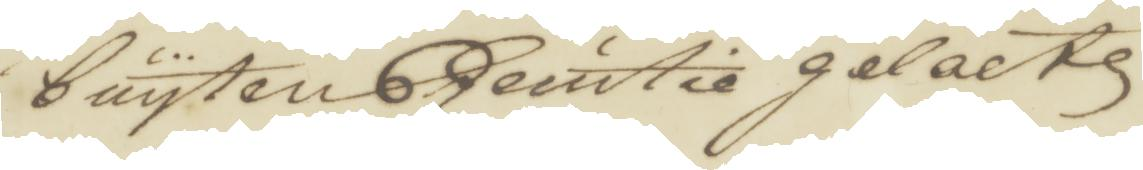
buijten Executie gelaeten
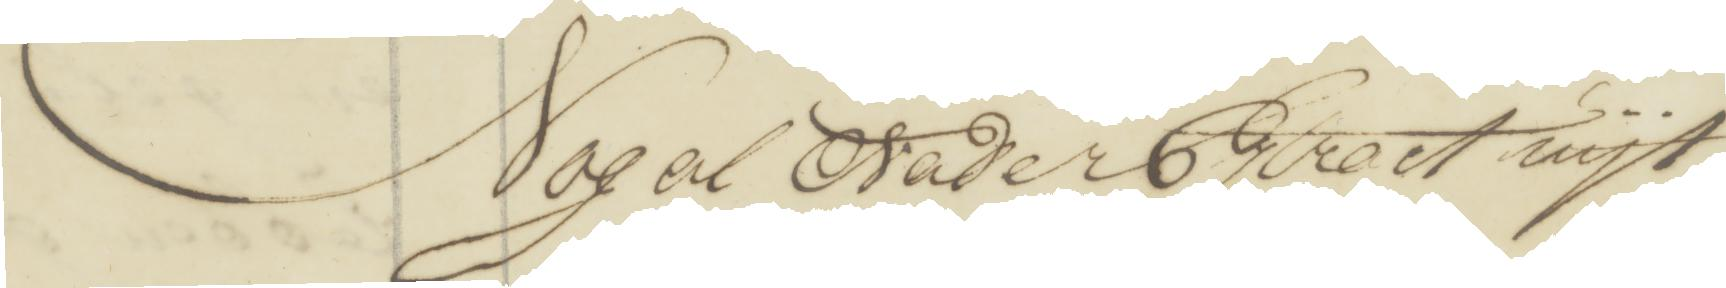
Nog al Nader Extract uijt
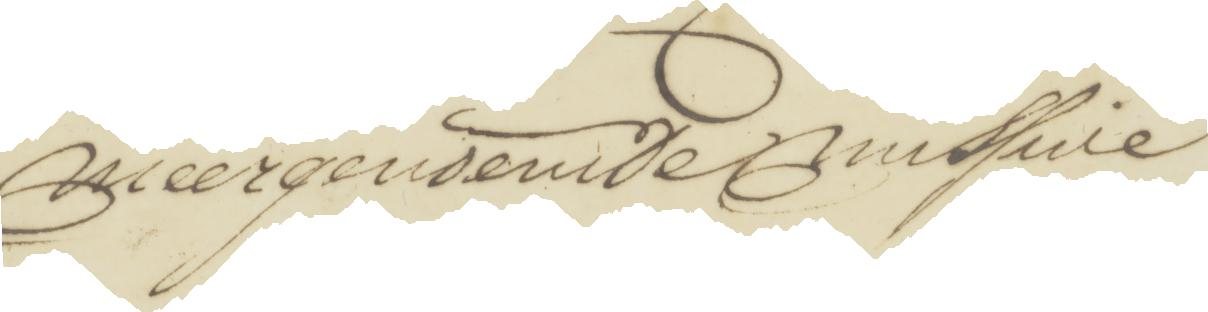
meergenoemde missive
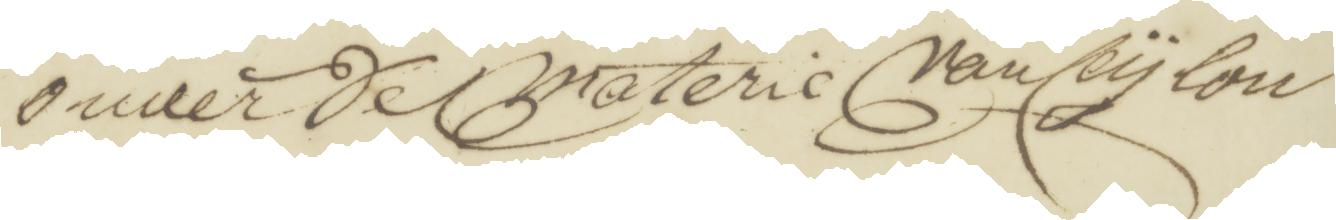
onder de materie van Ceijlon
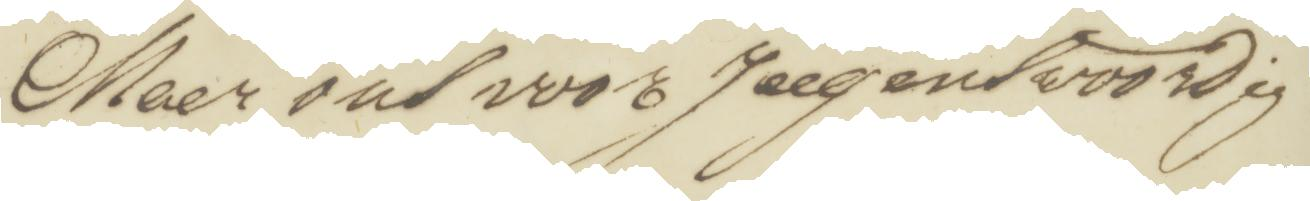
Maer ons voor Jeegens woordig
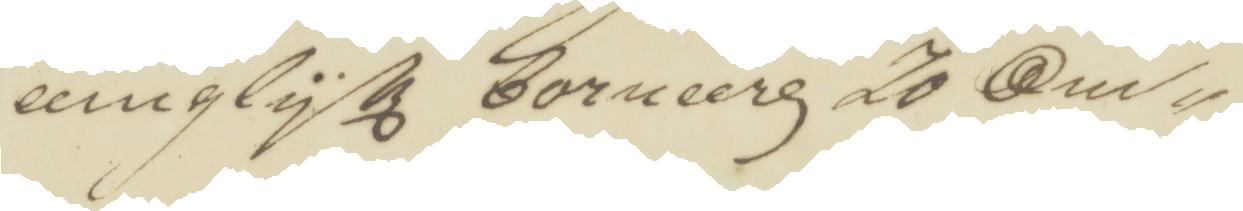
eeniglijk borneeren zo Om„
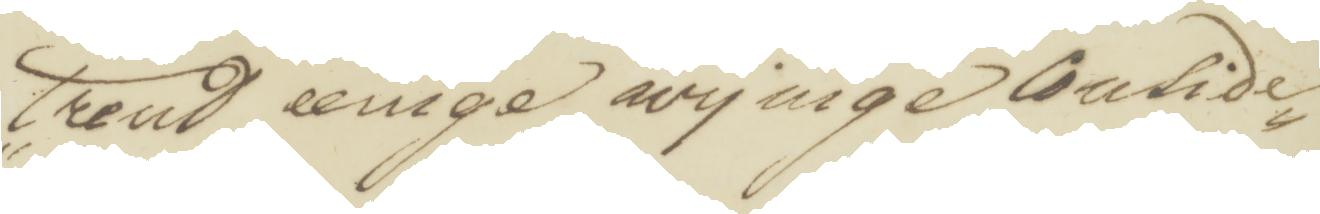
„trend eenige wijnige conside„
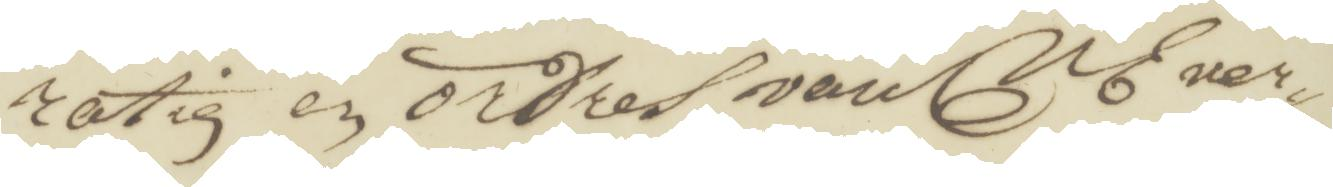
ratien en ordres van uE ver„
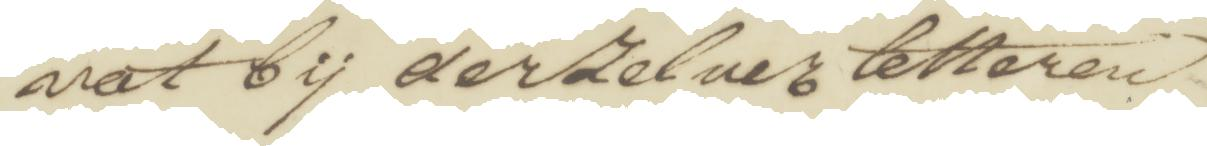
vat bij derzelver letteren
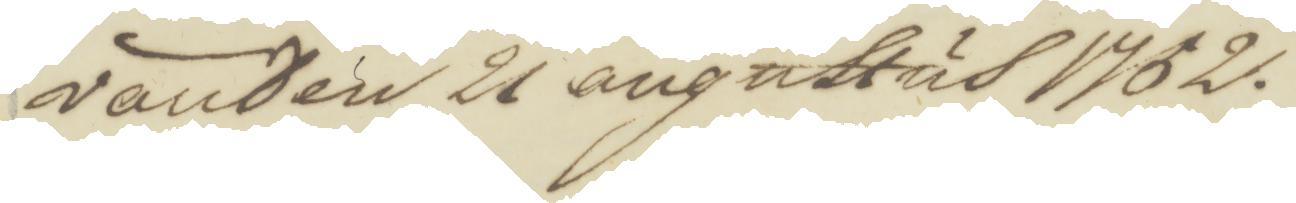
van den 21 augustus 1752.
